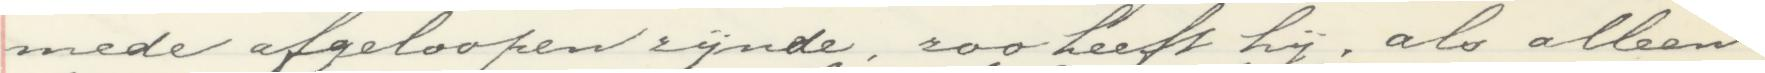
mede afgeloopen zijnde, zoo heeft hij, als alleen
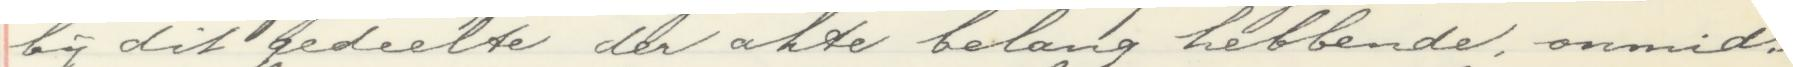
bij dit gedeelte der akte belang hebbende, onmid„
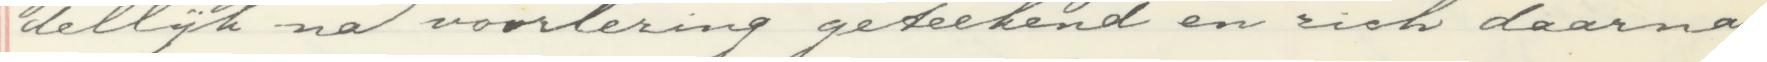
dellijk na voorlezing geteekend en zich daarna
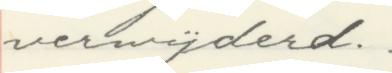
verwijderd.
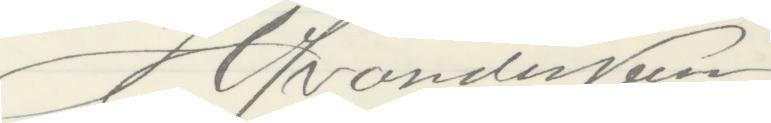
HJvanderVeen
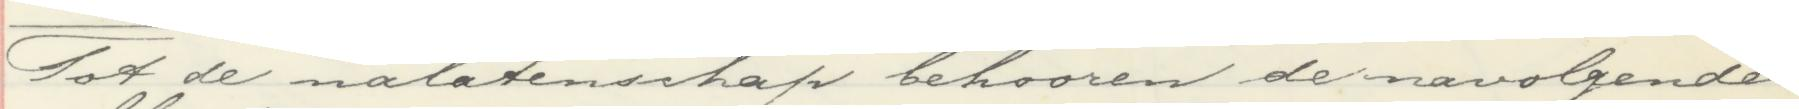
Tot de nalatenschap behooren de navolgende
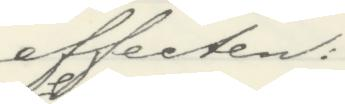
effecten:
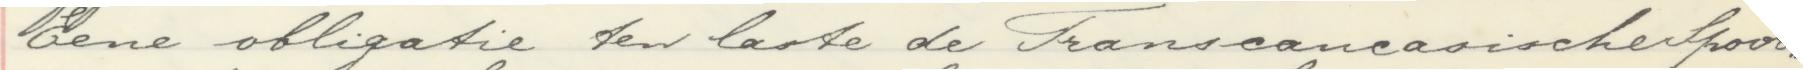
Eene obligatie ten laste de Transcaucasische Spoor
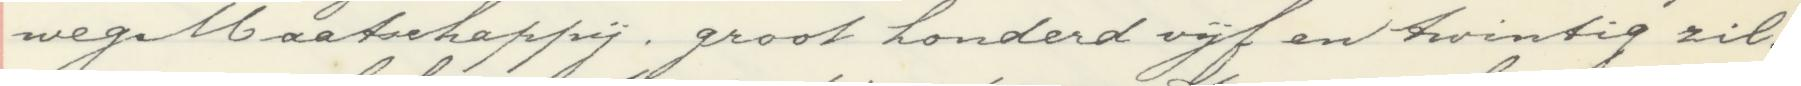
weg Maatschappij, groot honderd vijf en twintig zil„
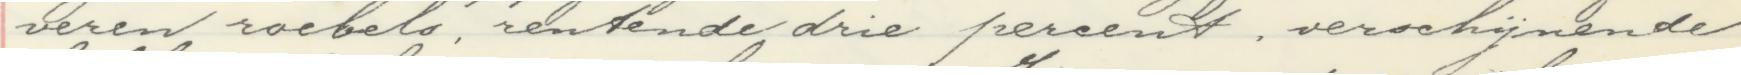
veren roebels, rentende drie percent, verschijnende
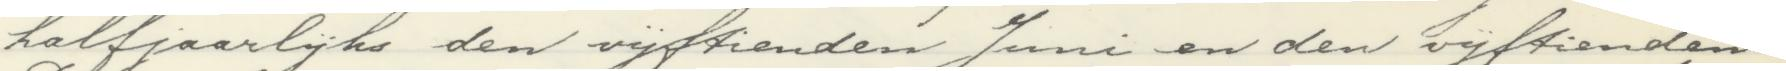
halfjaarlijks den vijftienden Juni en den vijftienden
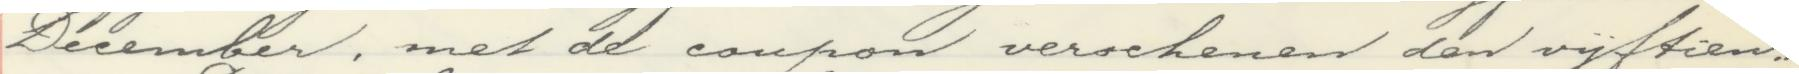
December, met de coupon verschenen den vijftien„
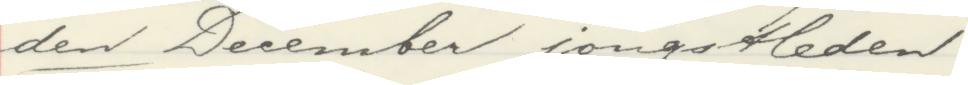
den December jongstleden
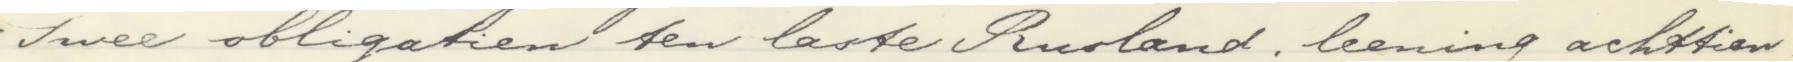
Twee obligatien ten laste Rusland, leening achttien
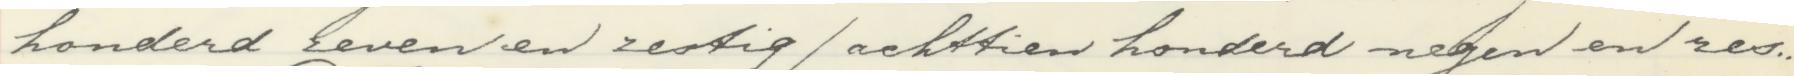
honderd zeven en zestig / achttien honderd negen en zes„
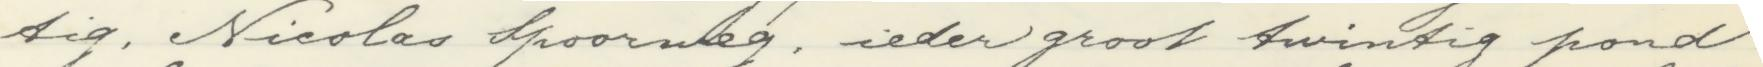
tig, Nicolas Spoorweg, ieder groot twintig pond
